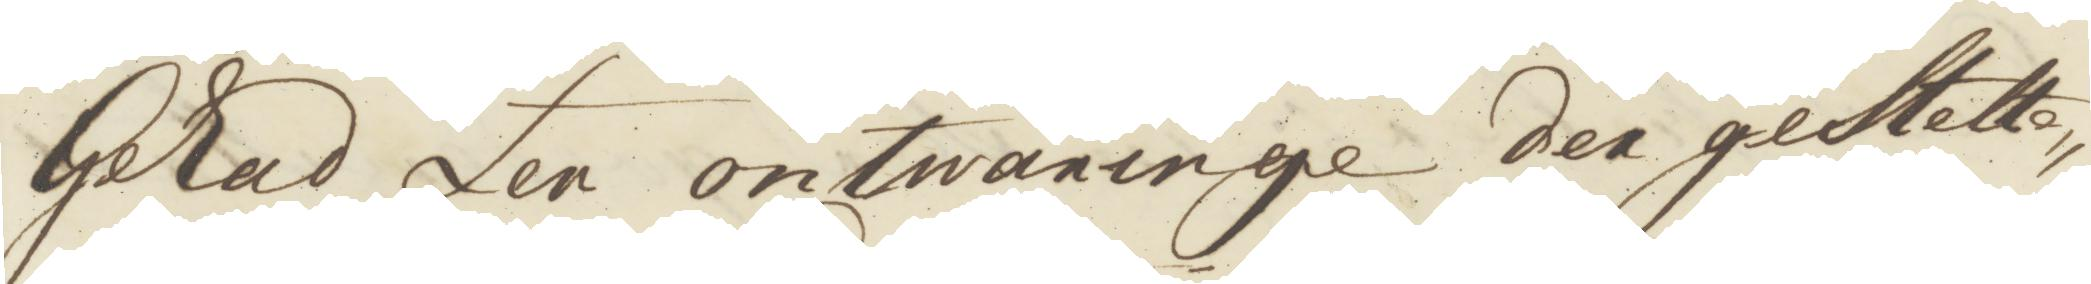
Gehad ter ontwaringe der gestelte„
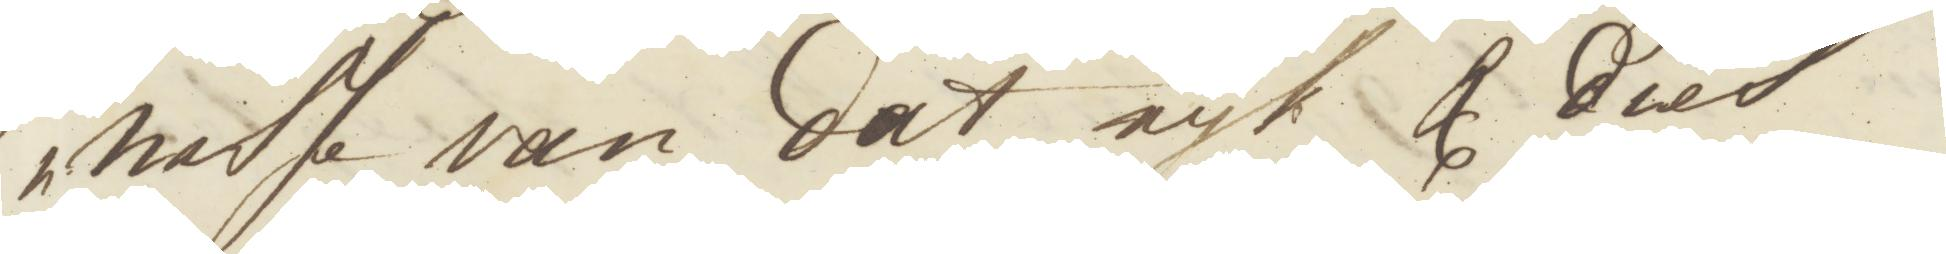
„nisse van dat rijk & dies
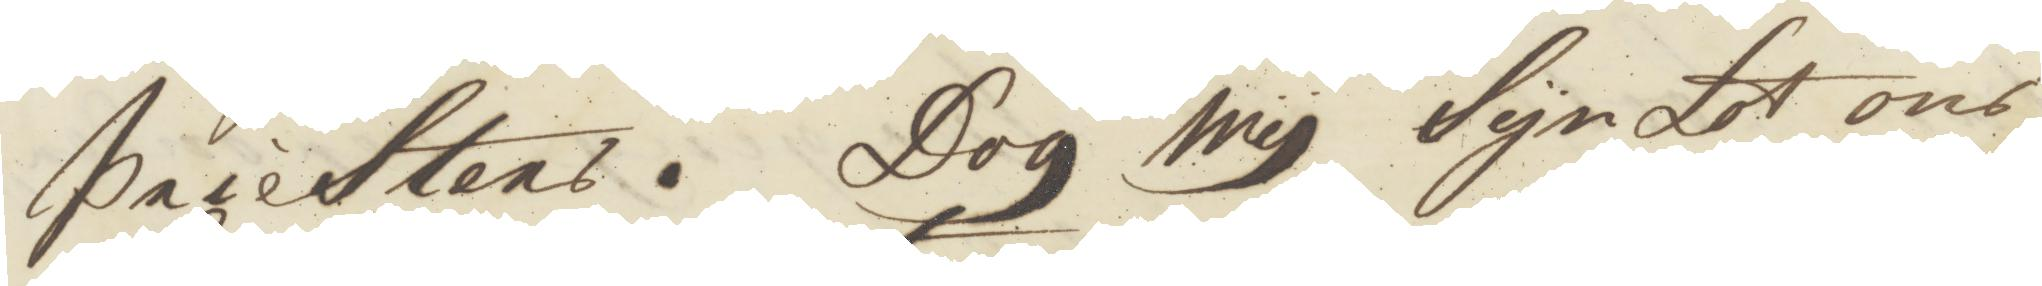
priesters. Dog wij sijn tot ons
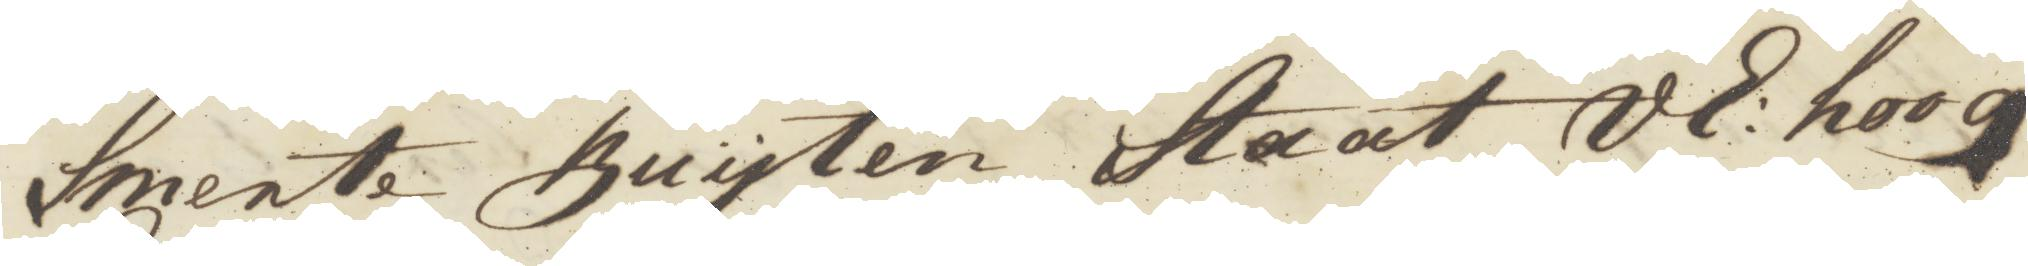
smerte Buijten staat uE: hoog
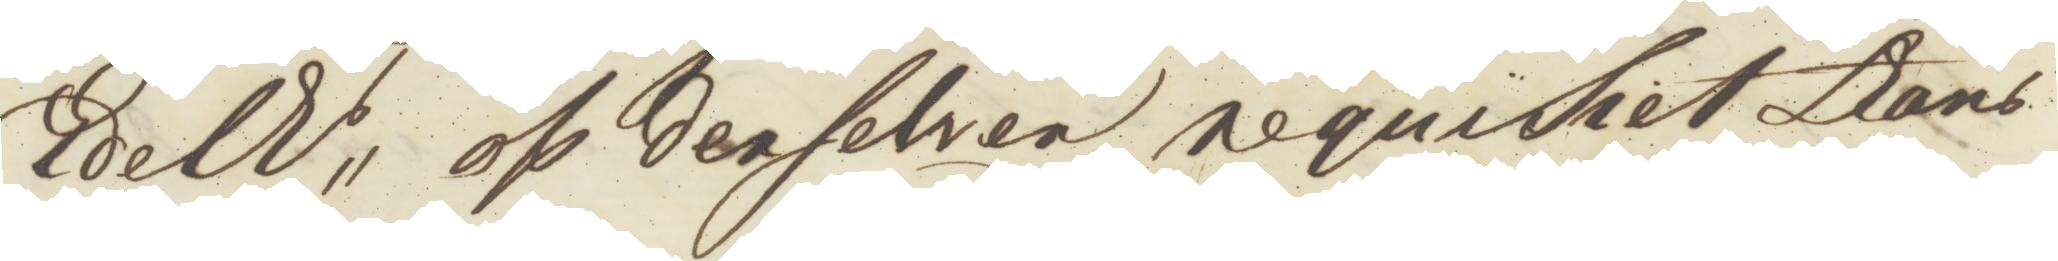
Edelh„s op denselven requisiet thans
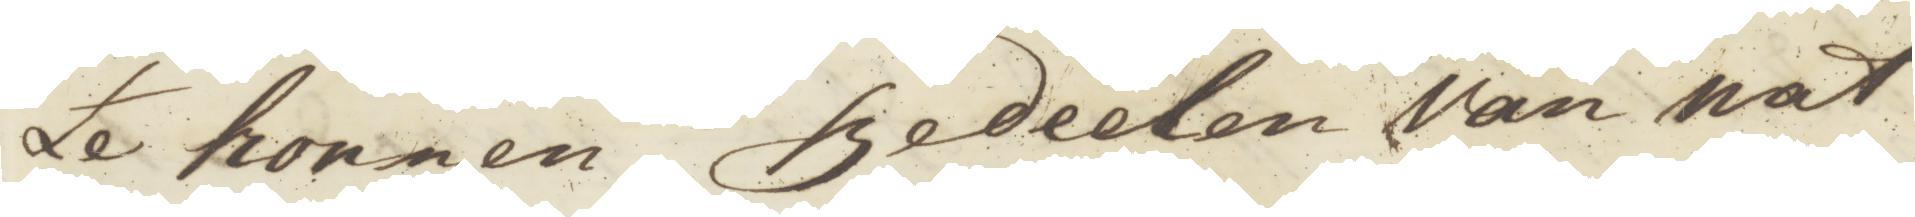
te konnen Bedeelen van wat
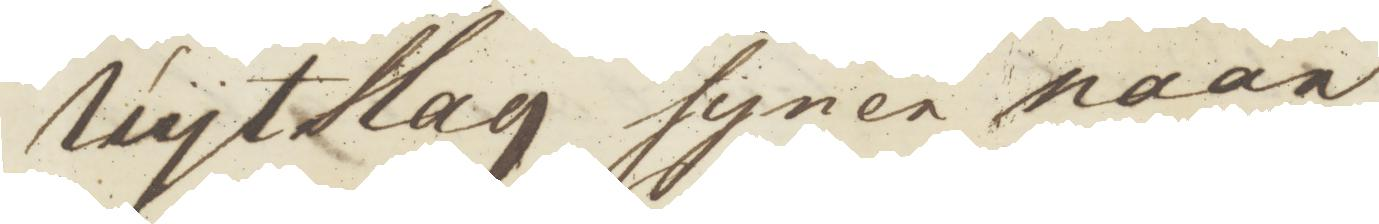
uijtslag sijn er naar
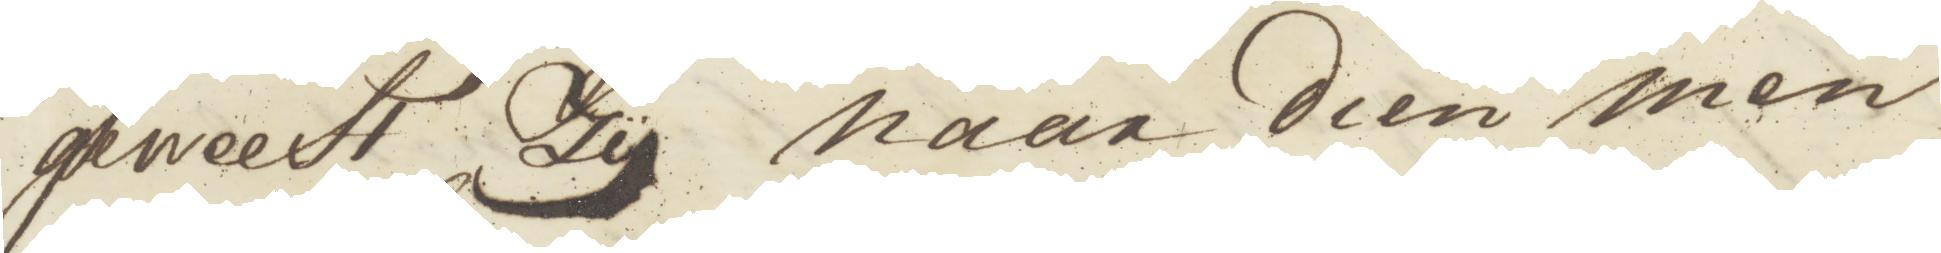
geweest zij naar dien men
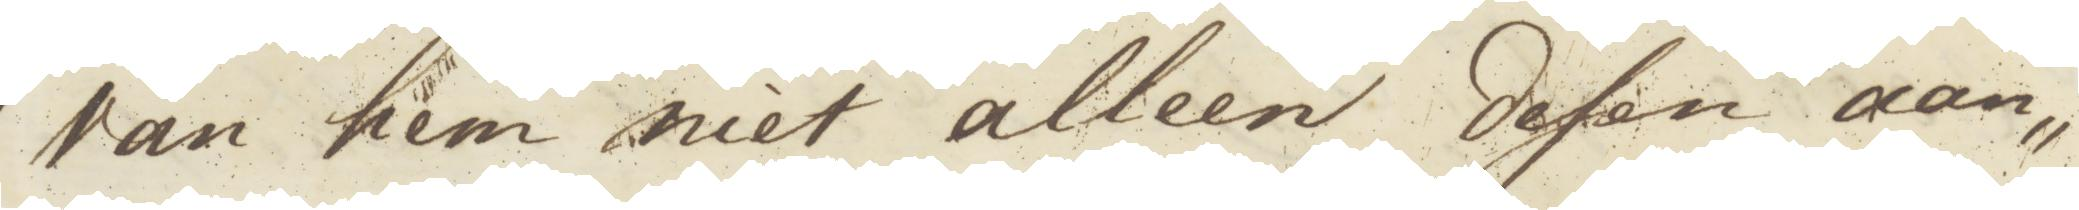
van hem niet alleen desen aan„
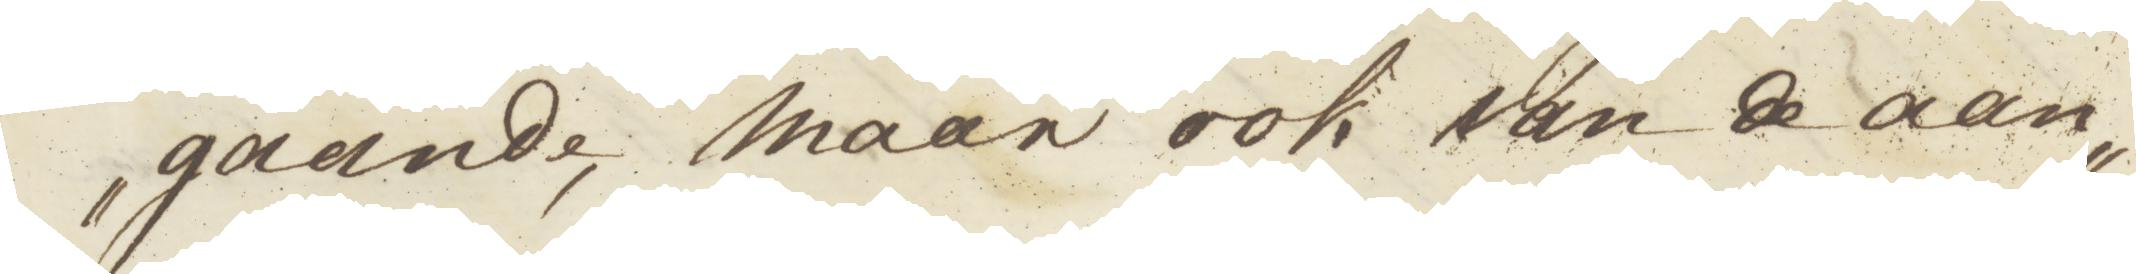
„gaande, maar ook van de aan„
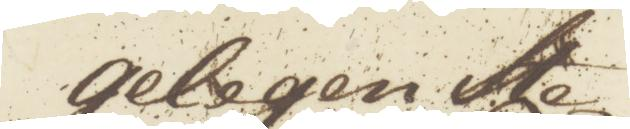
gelegen ste
